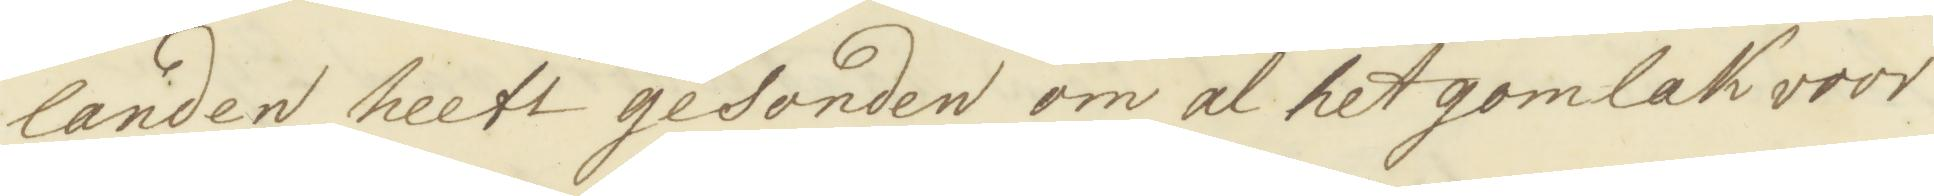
landen heeft gesonden om al het gomlak voor
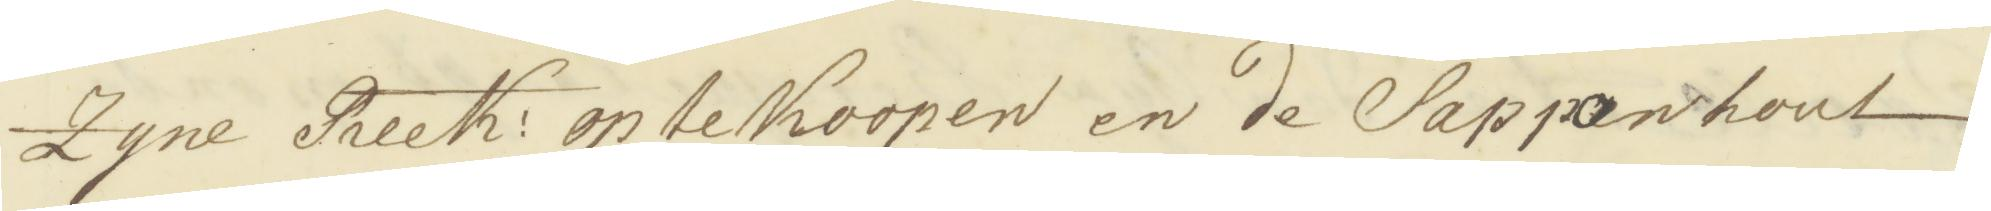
zyne Reek: op te koopen en de Sappanhout
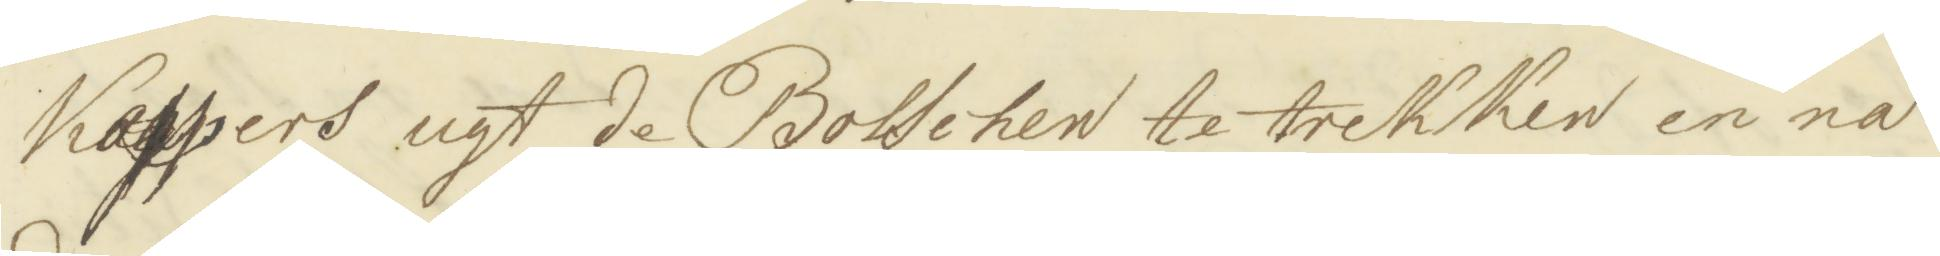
kappers uyt de Bosschen te trekken en na
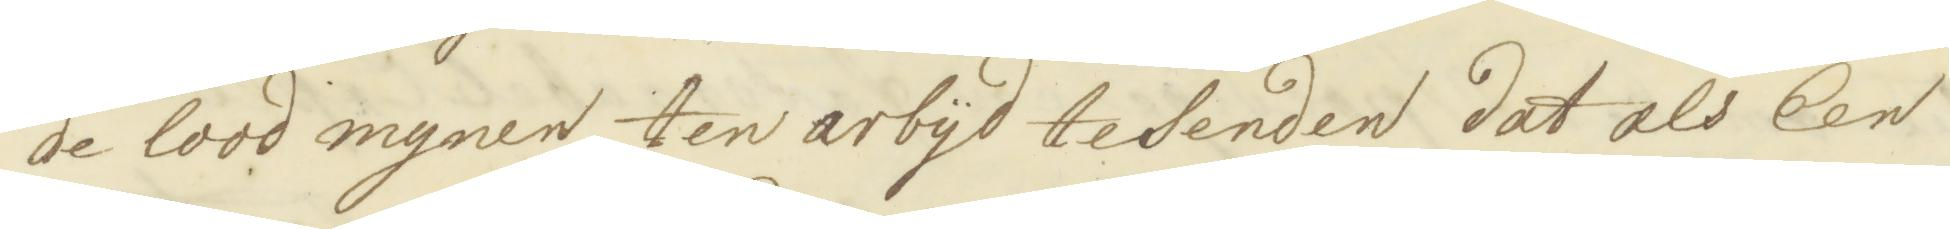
de lood mynen ten arbijd tesenden dat als Een
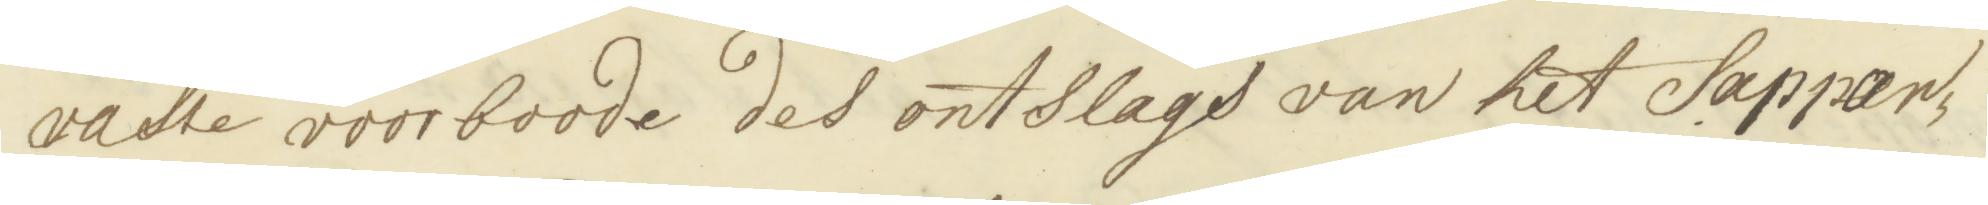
vaste voor boode des ontslags van het Sappan„
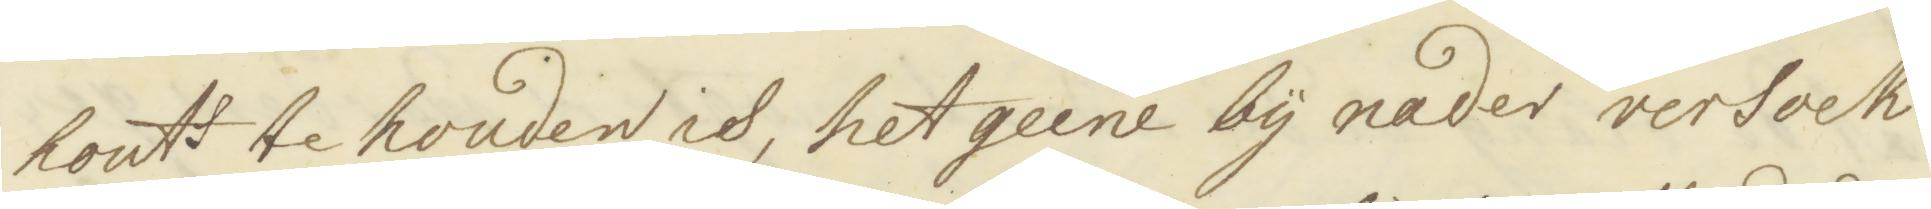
houts te houden is, het geene bij nader versoek
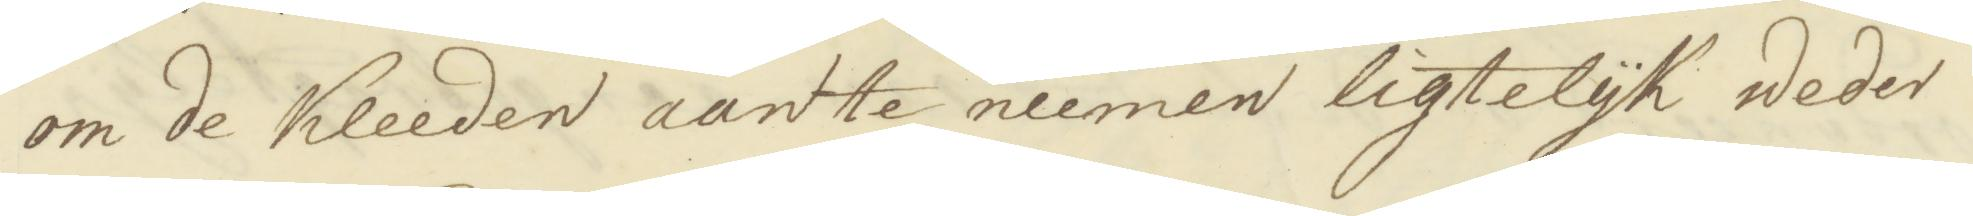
om de kleeden aan te neemen ligtelijk weder
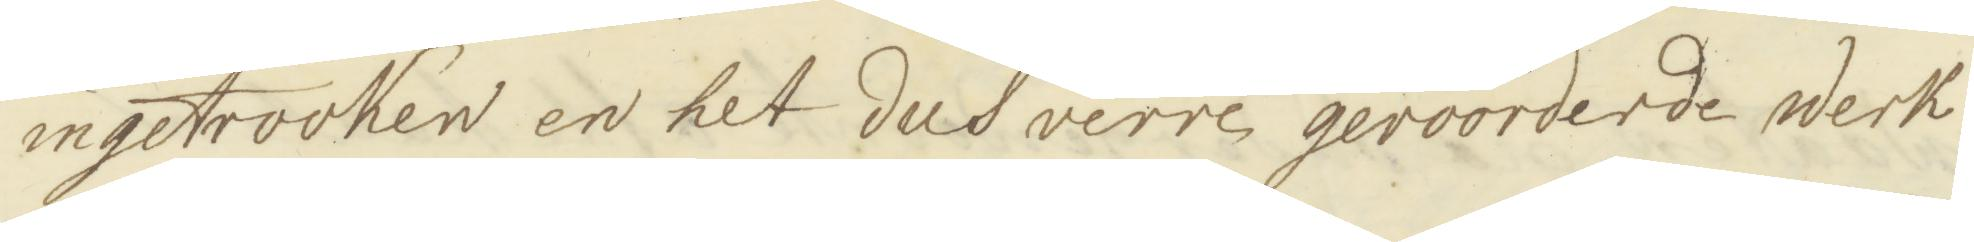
ingetrooken en het dus verre gevoorderde werk
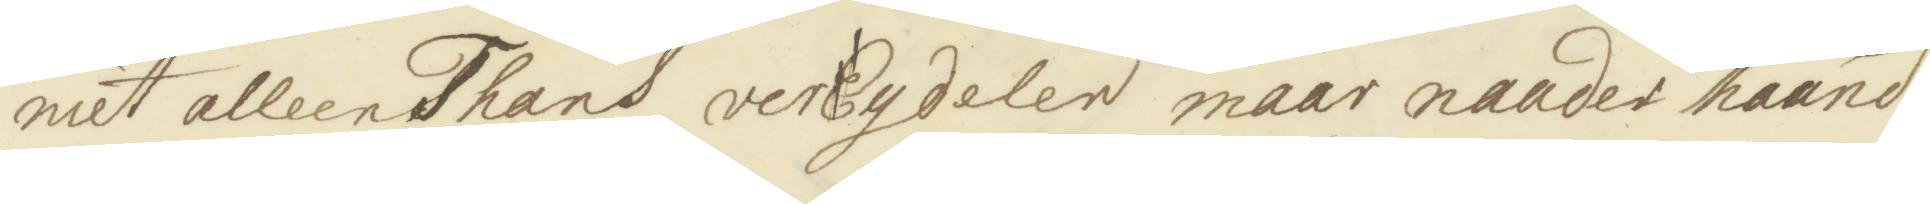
niet alleen Thans verEydelen maar naader haand
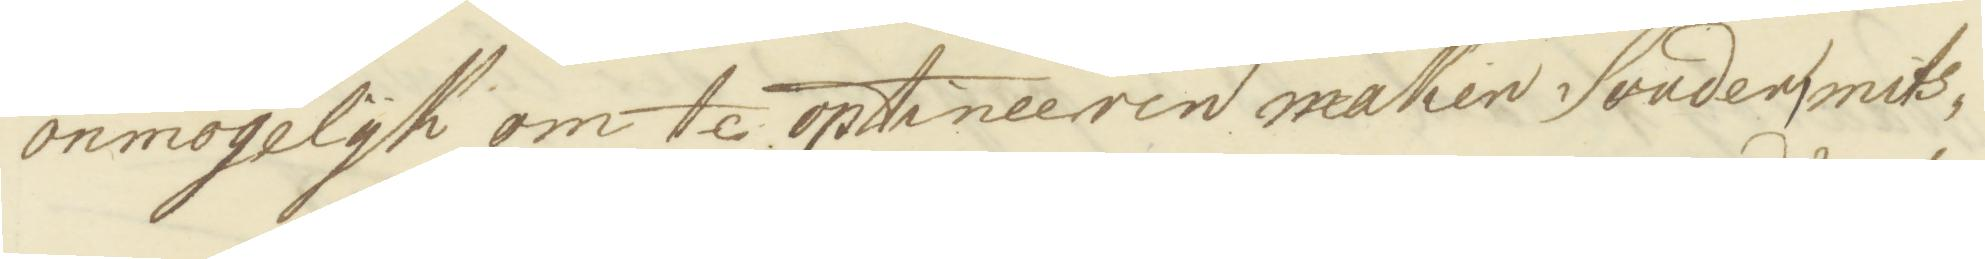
onmogelijk om te optineeren maken, souden, mits„
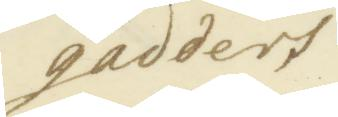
gadders
